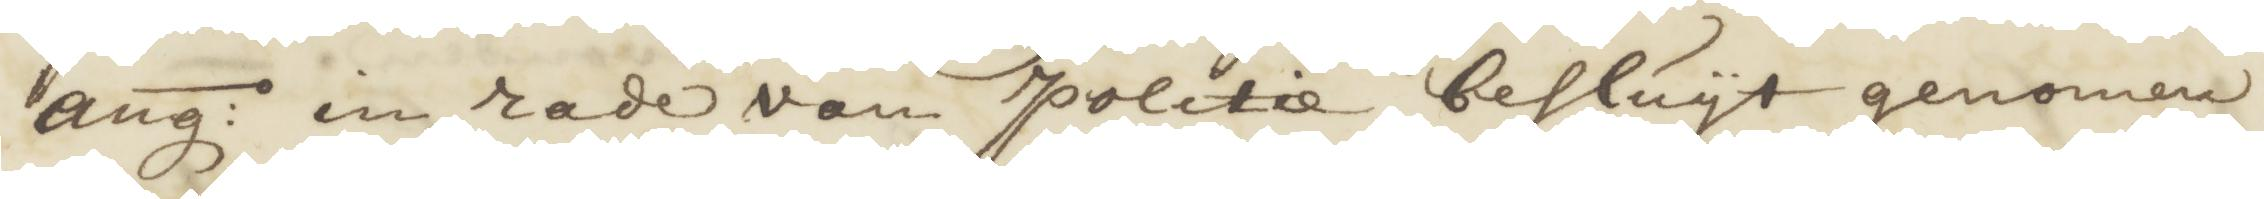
aug: in rade van politie besluijt genomen
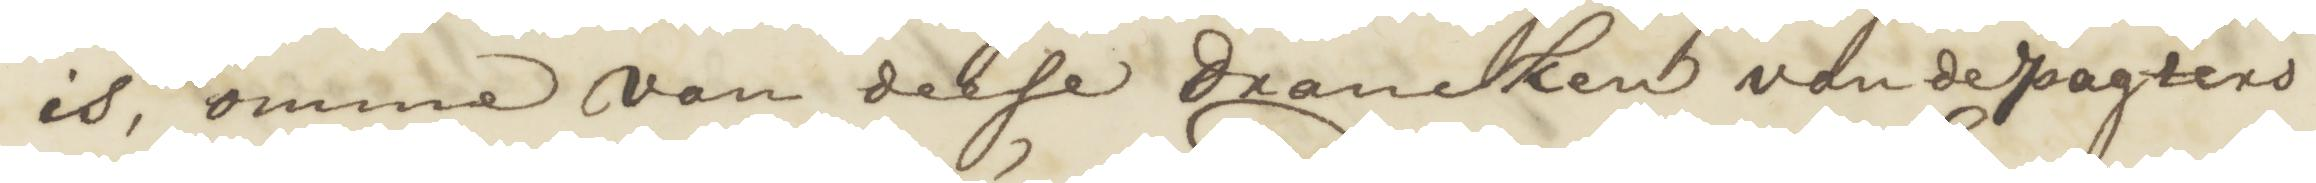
is, omme van deese drancken van de pagters
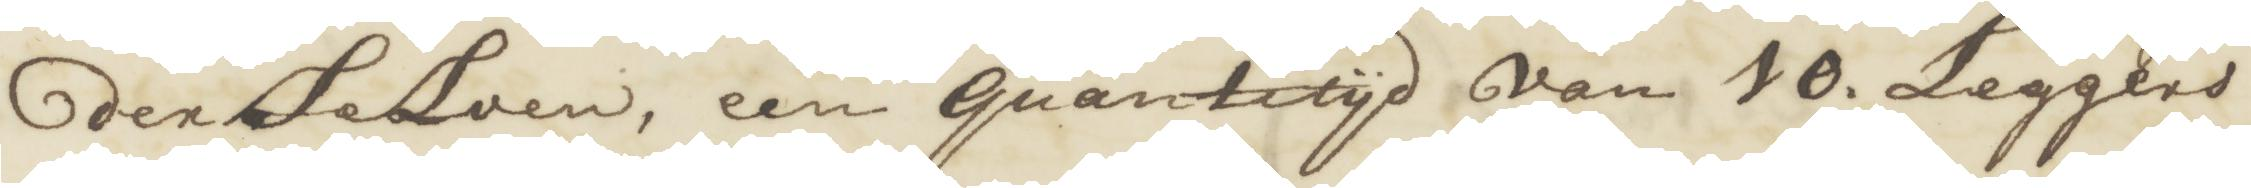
der selven, een quantitijd van 10. Leggers
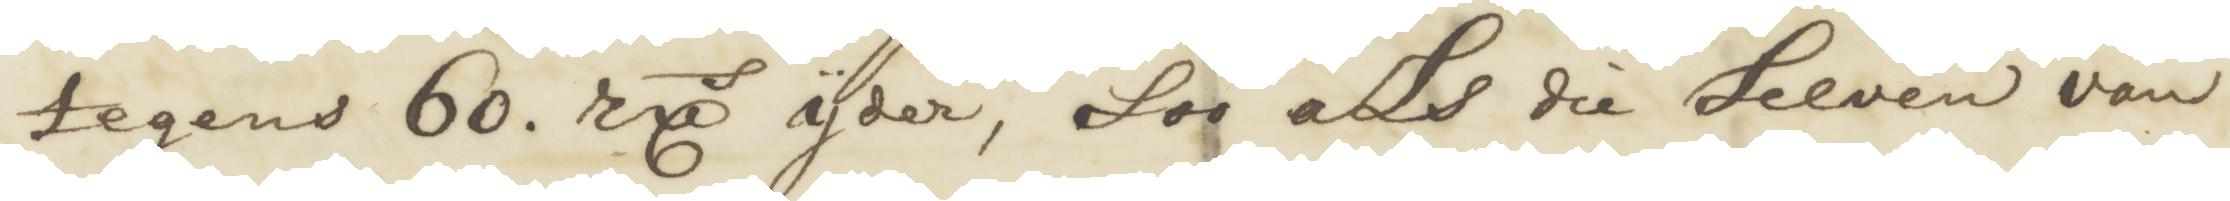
tegens 60. rxs ijder, soo als die selven van
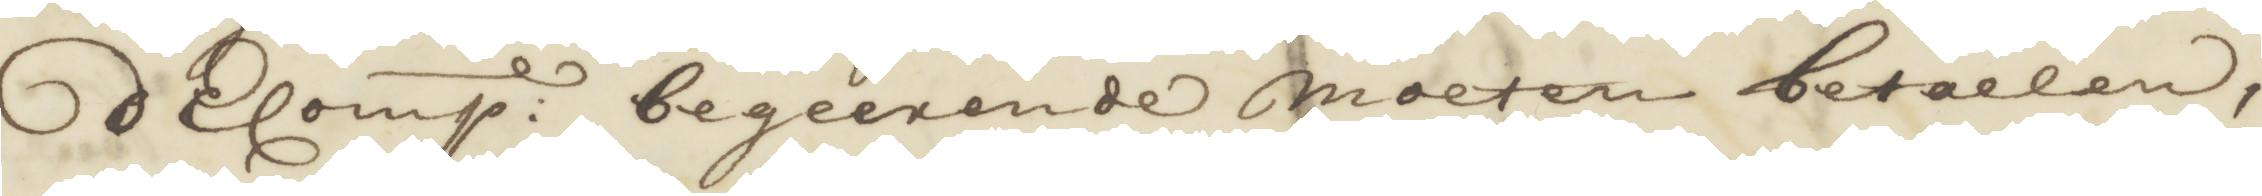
d E Comp:' begeerende moeten betaelen,
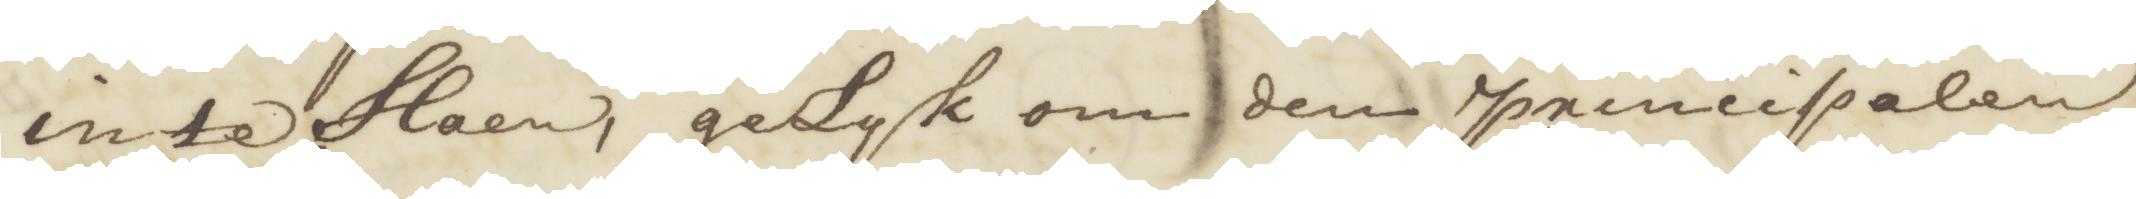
in te slaen, gelyk om den principalen
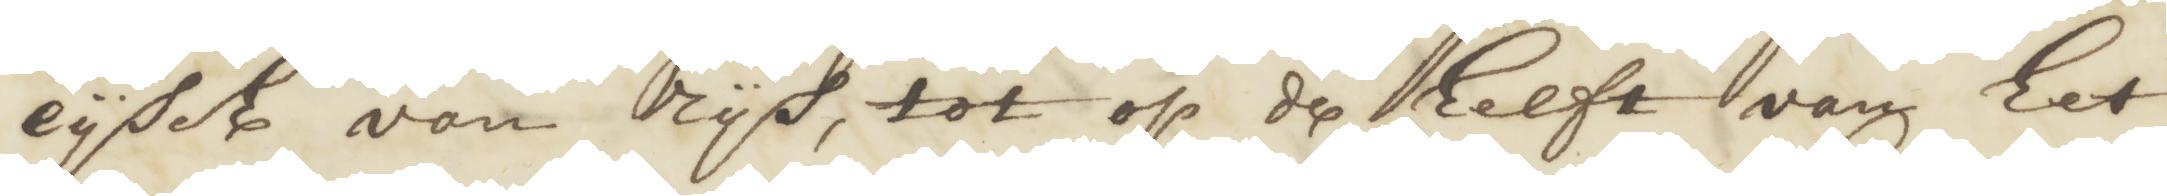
eijsch van rijs, tot op de helft van het
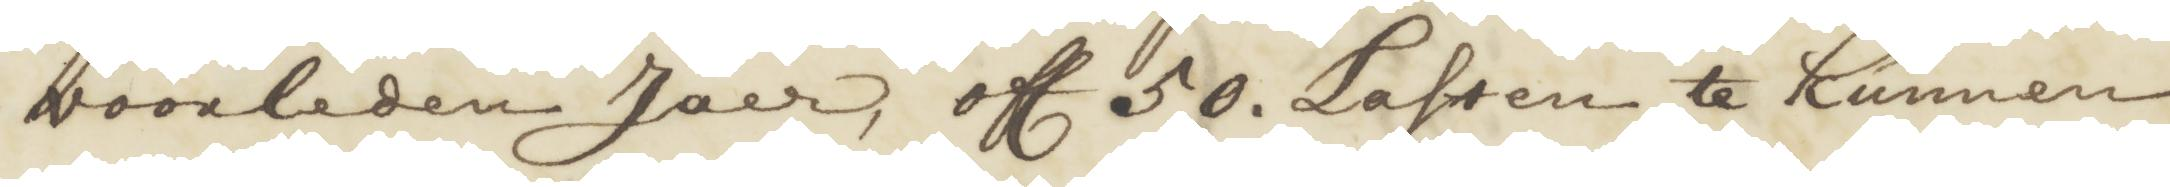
voorleden Jaer, of 50. lasten te kunnen
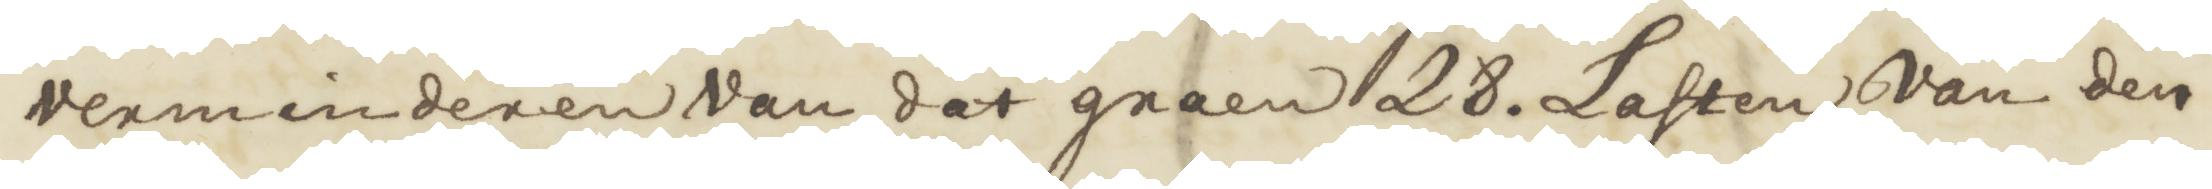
verminderen van dat graen 28. lasten van den
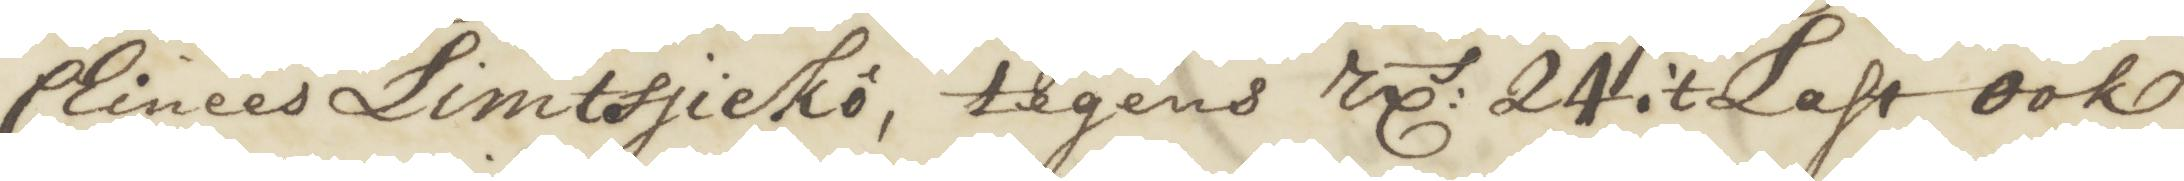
Chinees Limtsjiekô, tegens rx:s 24. ’t Last ook
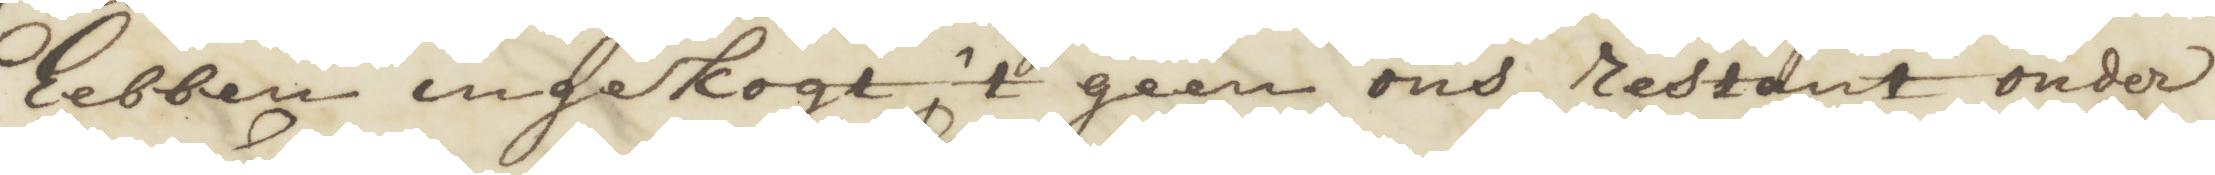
hebben ingekogt, ’t geen ons restant onder
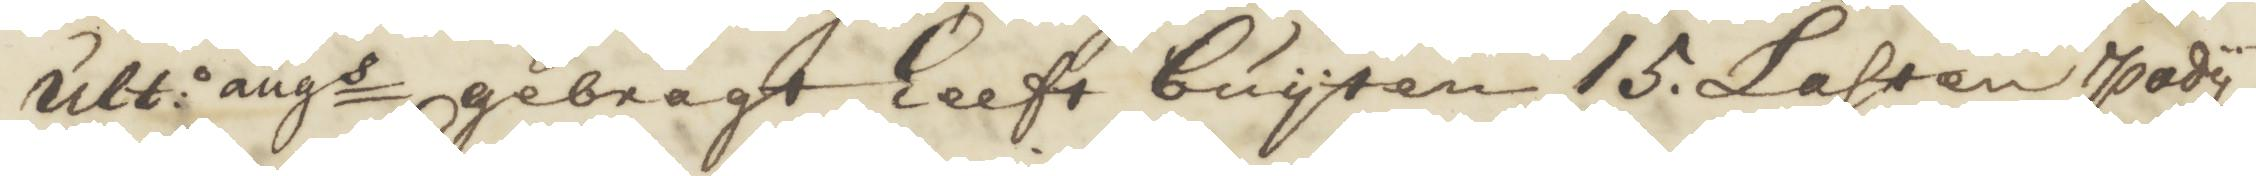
ult:o aug=s gebragt heeft buijten 15. lasten padij
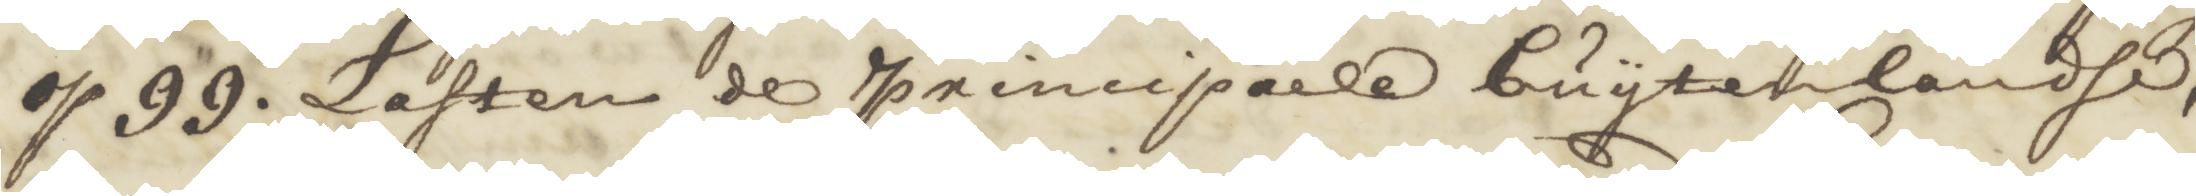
op 99. lasten de principaele buijtenlandse,
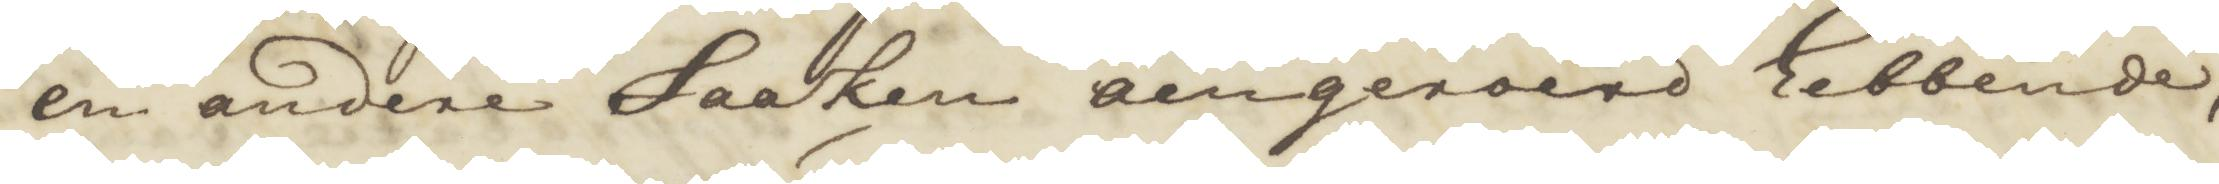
en andere saaken aengeroerd hebbende,
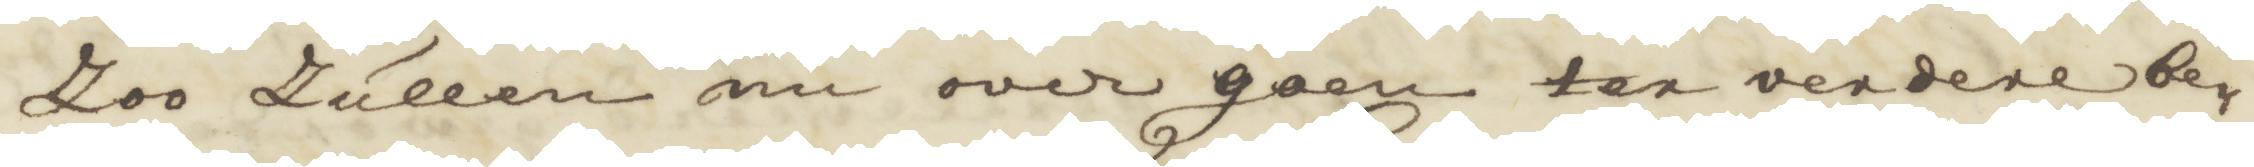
zoo zullen nu over gaen ter verdere be
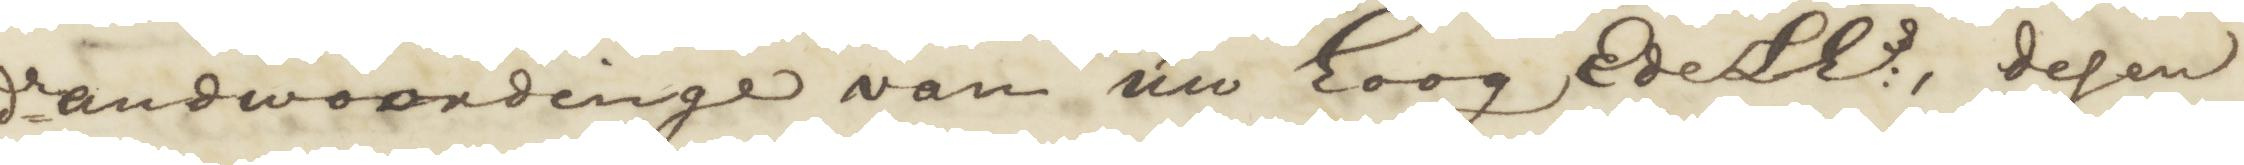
andwoordinge van uw hoog Edelh:s, desen
